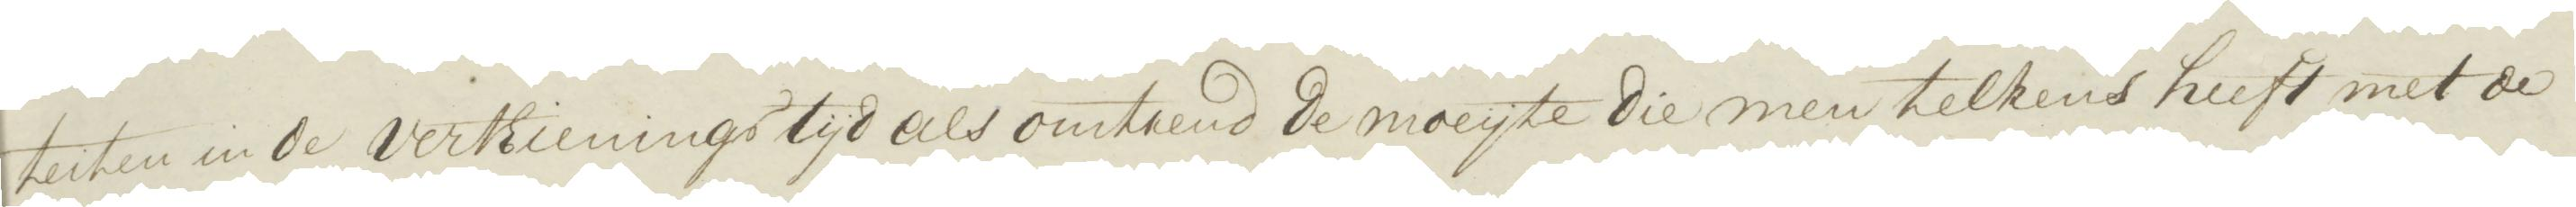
teiten in de verthienings tijd als omtrend de moeijte die men telkens heeft met de
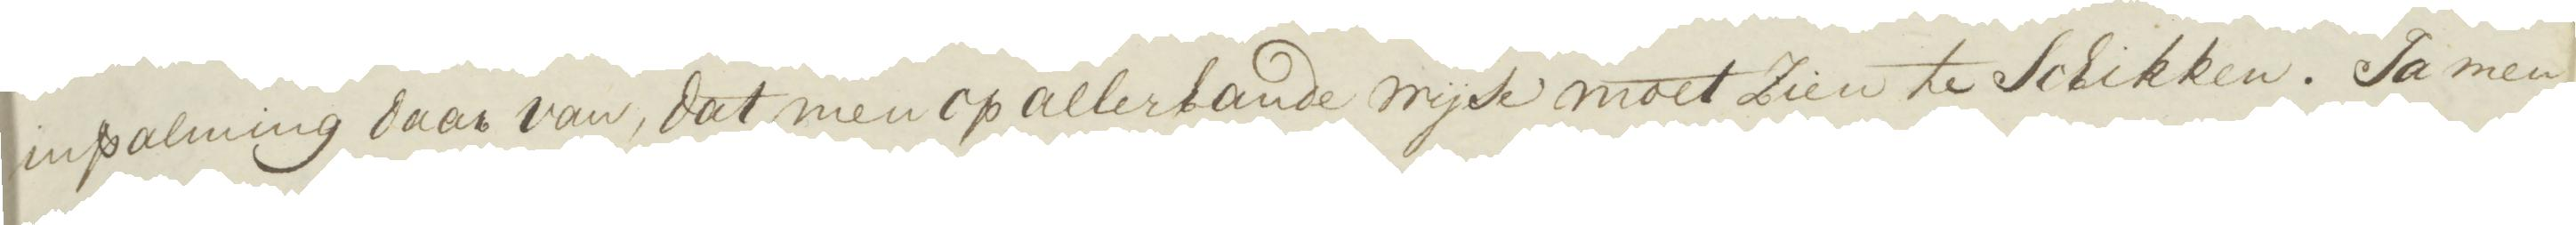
inpalming daar van, dat men op allerhande wijse moet zien te schikken. Ia men
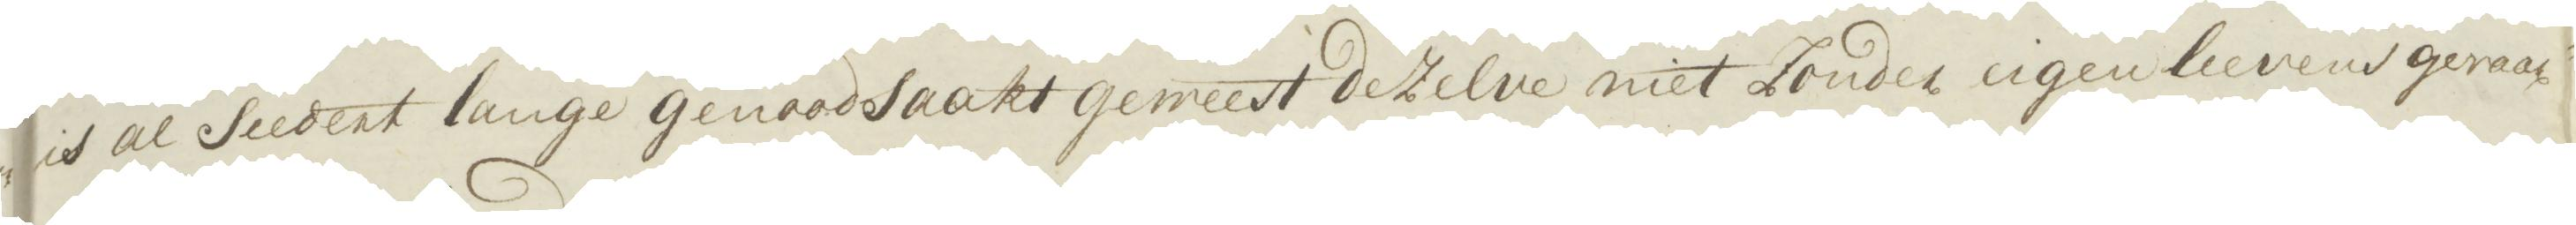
is al seedert lange genoodsaakt geweest dezelve niet zonder eigen leevens gevaar
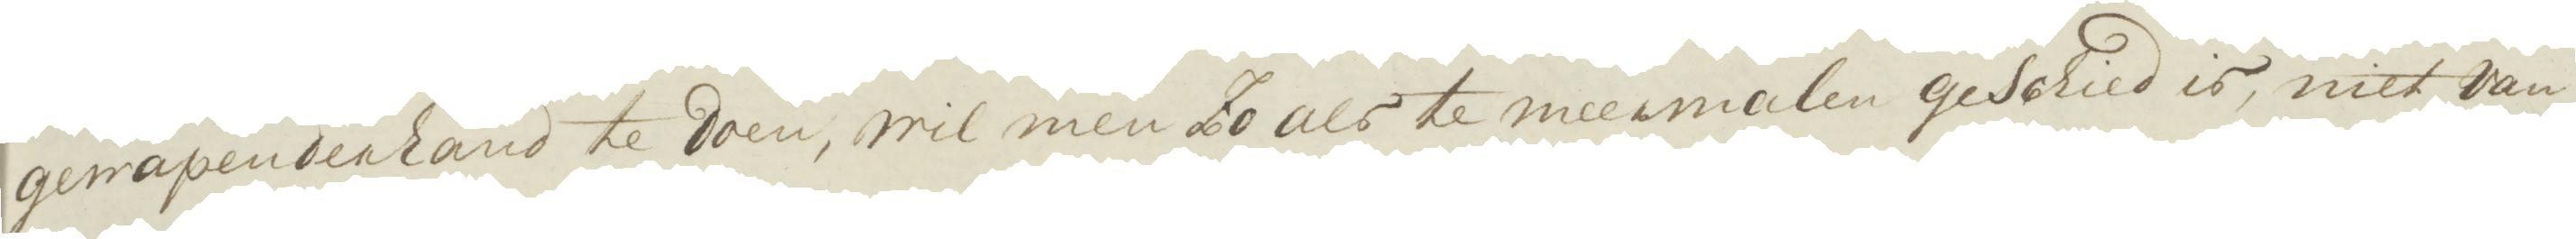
gewapenderhand te doen, wil men zo als te meermalen geschied is, niet van
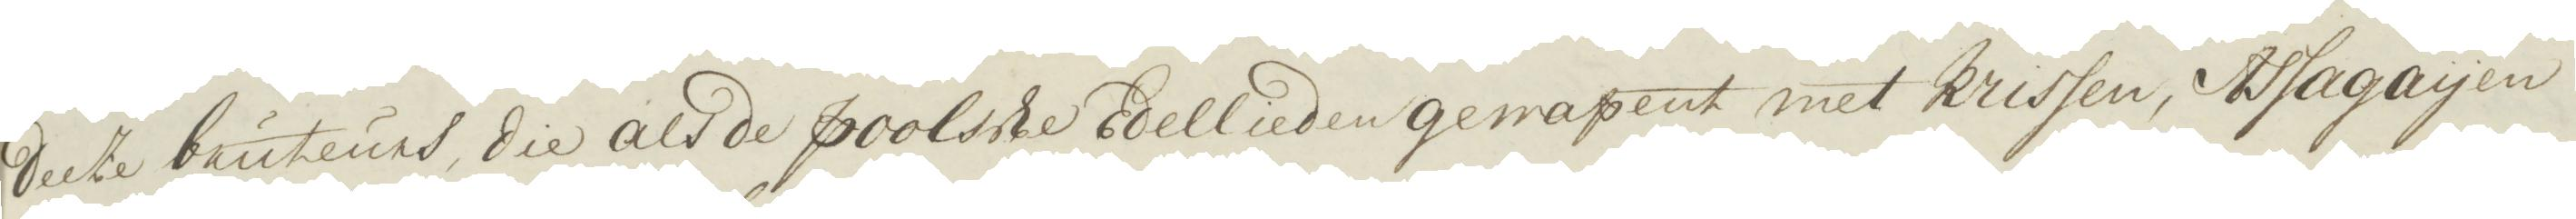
deeze bruteurs, die als de poolsche Edellieden gewapent met krissen, Assagaijen
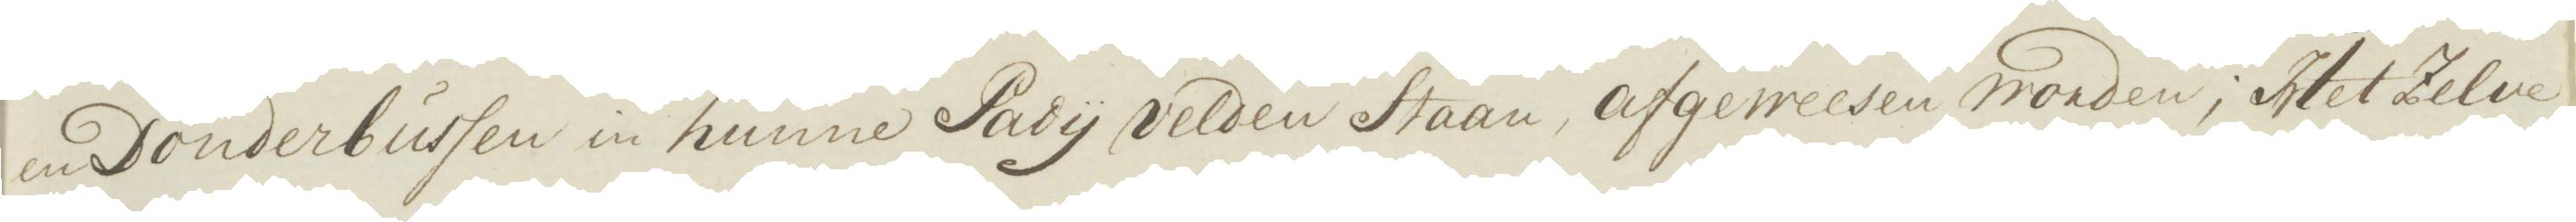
en Donderbussen in hunne Padij velden staan, afgeweesen worden; Het zelve
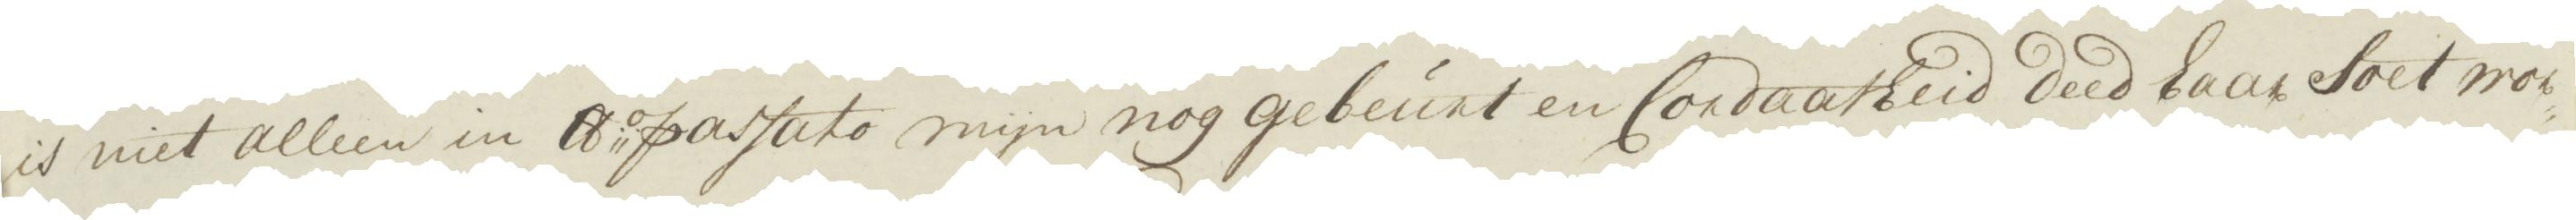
is niet alleen in A„o passato mijn nog gebeurt en Cordaatheid deed haar soet wor„
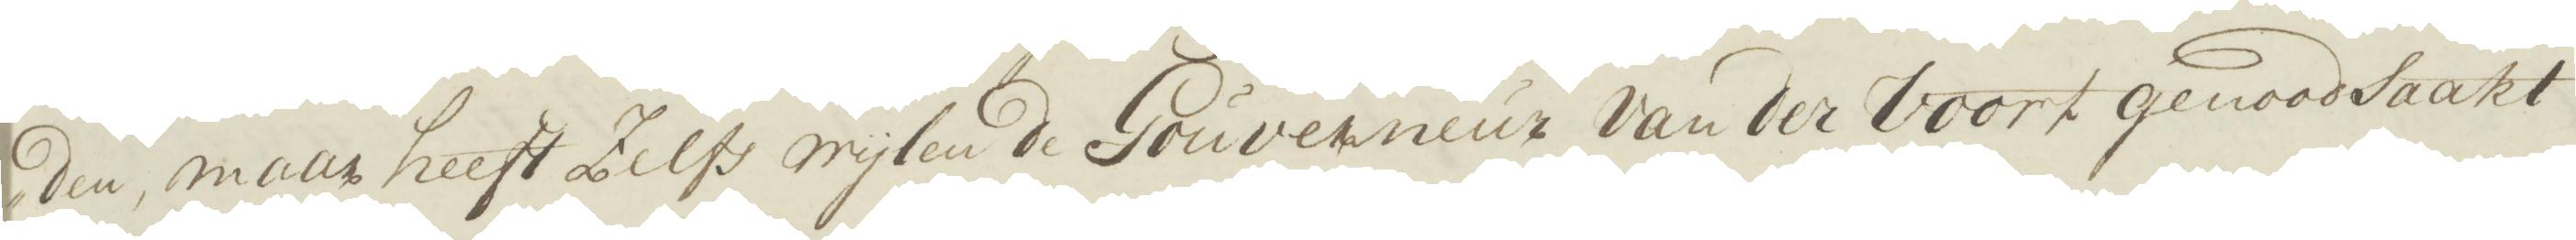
„den, maar heeft zelfs wijlen de Gouverneur van der voort genoodsaakt
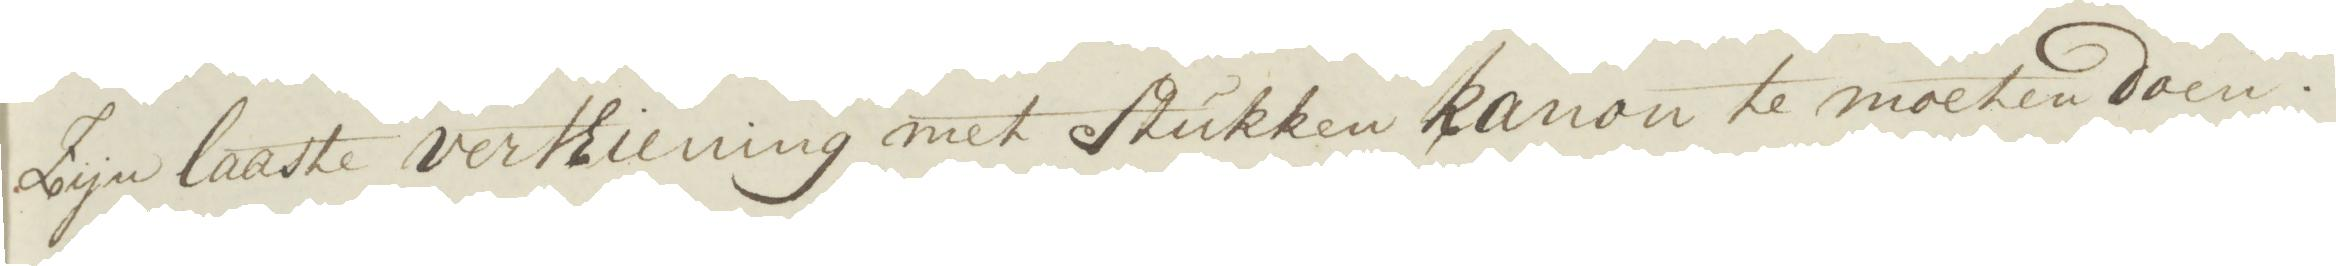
zijn laaste verthiening met stukken kanon te moeten doen.
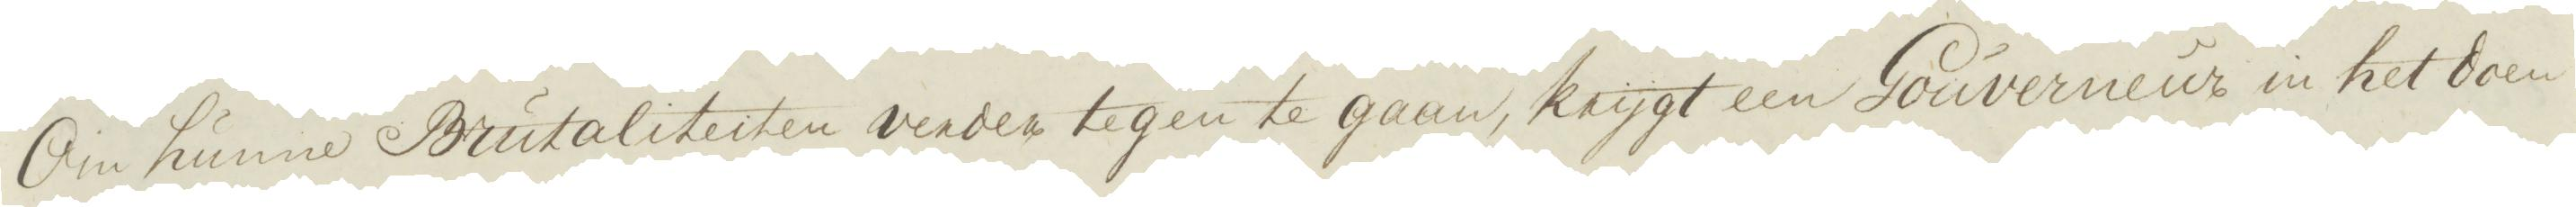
Om hunne Brutaliteiten verder tegen te gaan, krijgt een Gouverneur in het doen
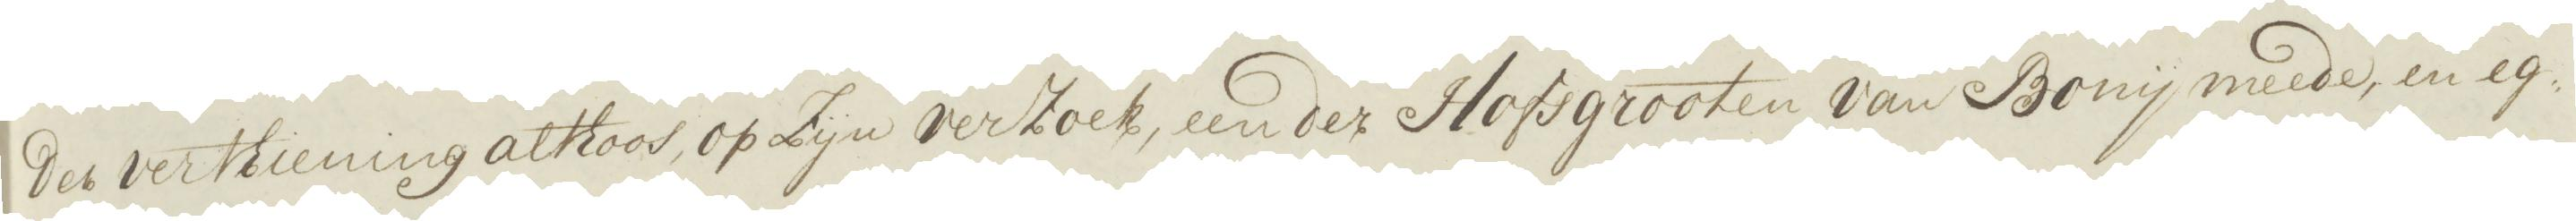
der verthiening althoos, op zijn verzoek, een der Hofsgrooten van Bonij meede, en eg„
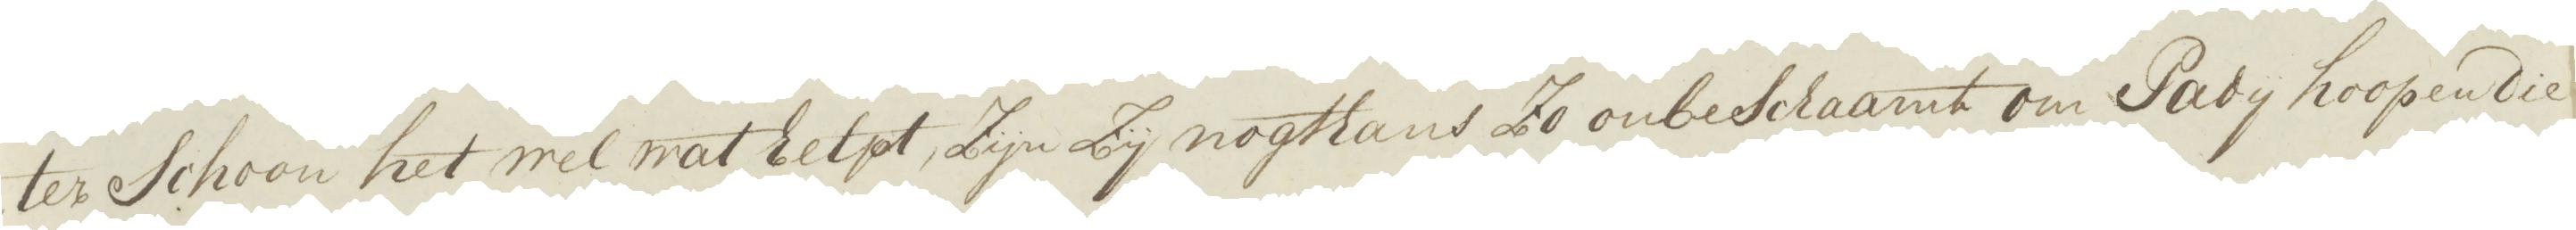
ter schoon het wel wat helpt, zijn zij nogthans zo onbeschaamt om Padij hoopen die
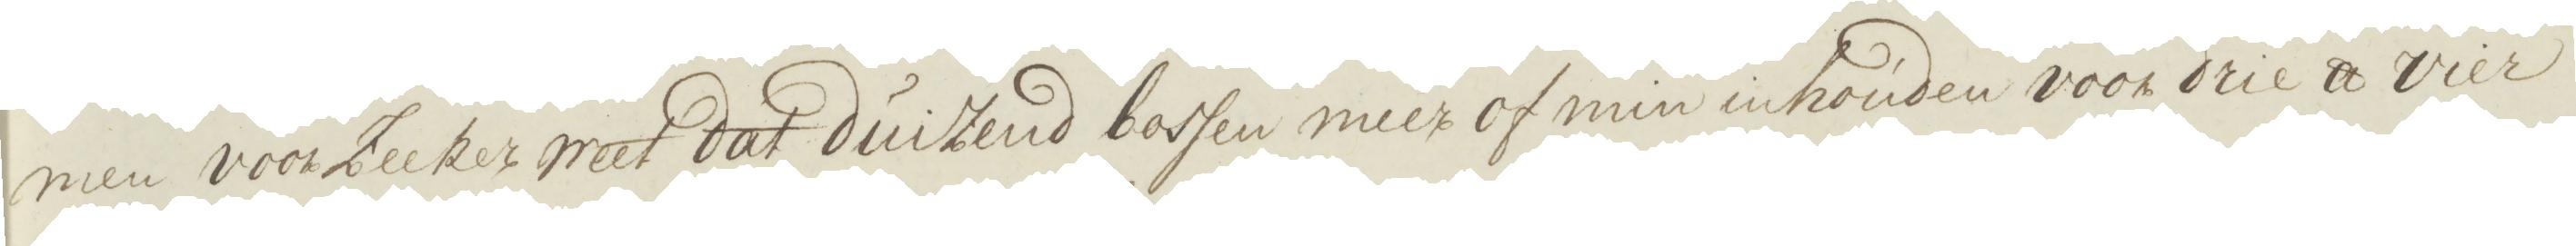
men voor zeeker weet dat duizend bossen meer of min inhouden voor drie a vier
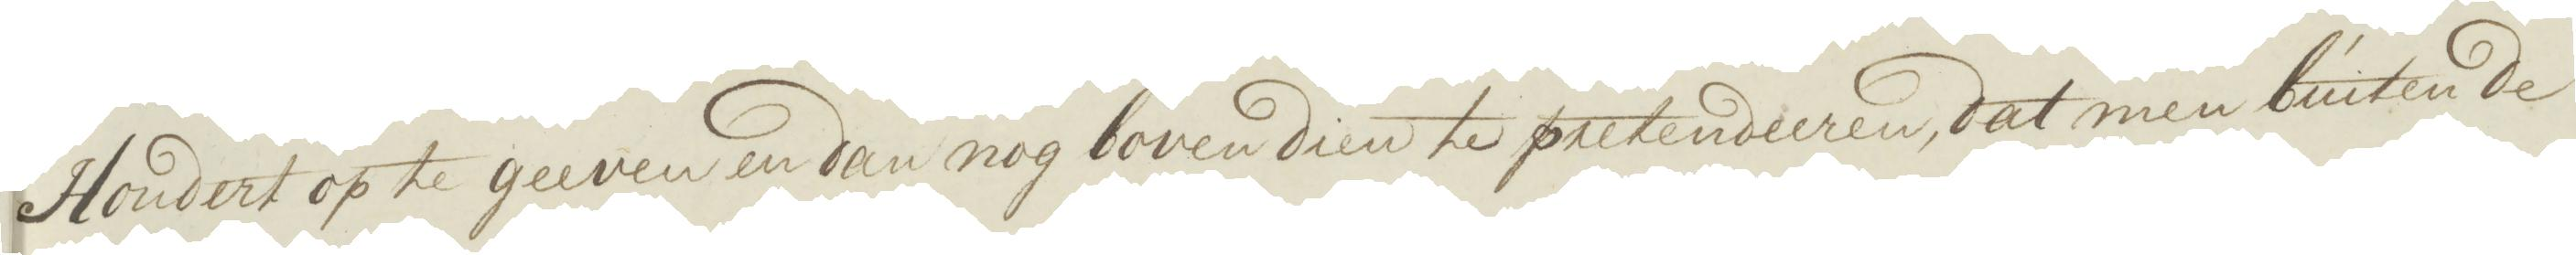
Hondert op te geeven en dan nog boven dien te pretendeeren, dat men buiten de
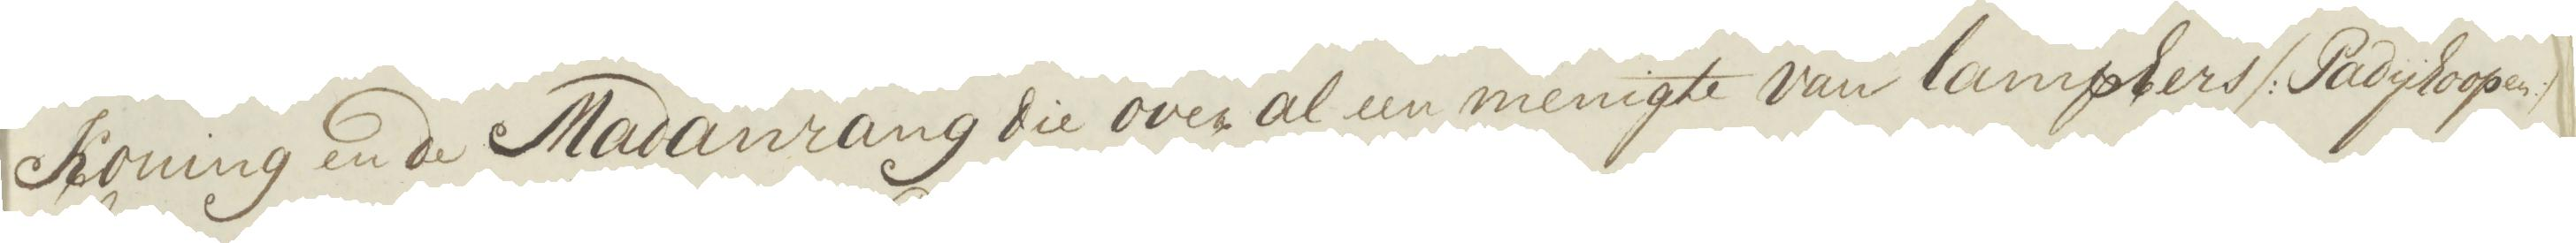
Koning en de Madanrang die over al een menigte van lamphers /: Padijhoopen :/
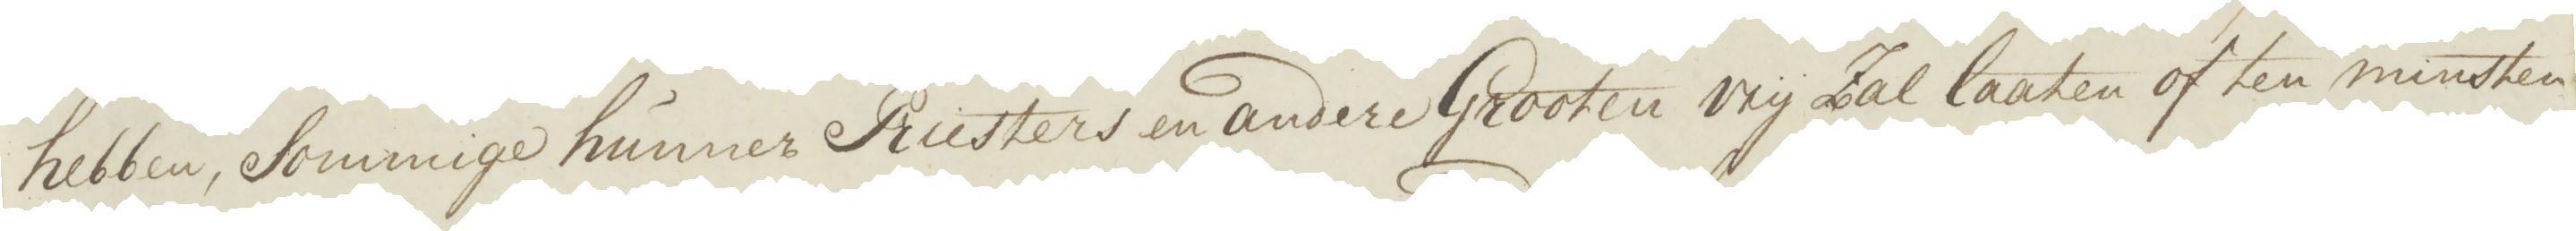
hebben, sommige hunner Priesters en andere Grooten vrij zal laaten of ten minsten
